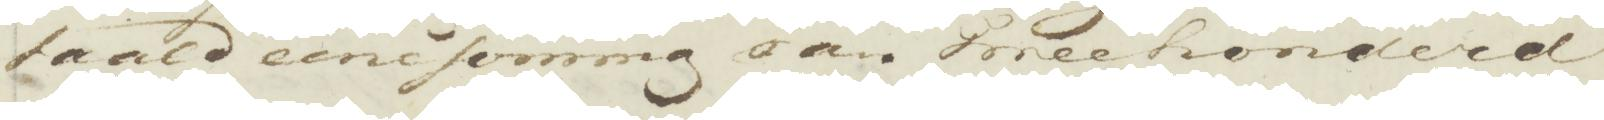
=taald eene somma van Tweehonderd
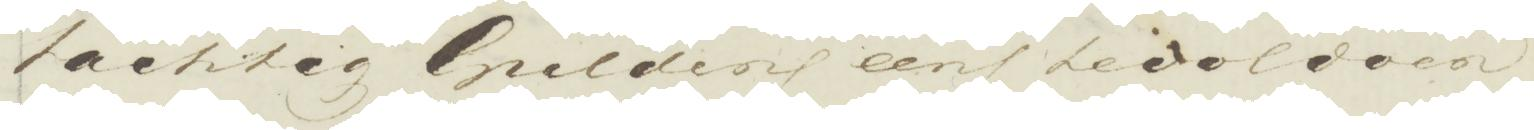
tachtig Guldens eens te voldoen
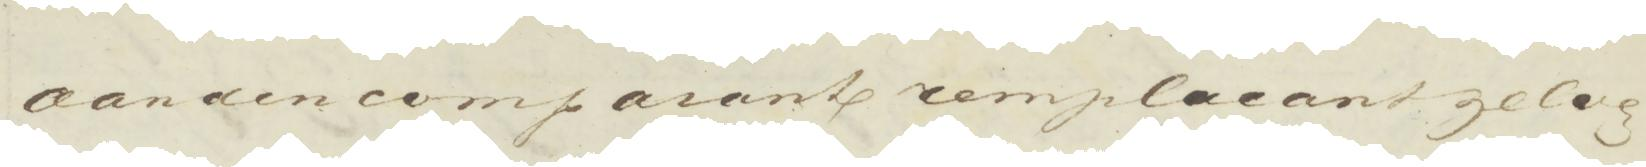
aan den comparant remplacant zelven
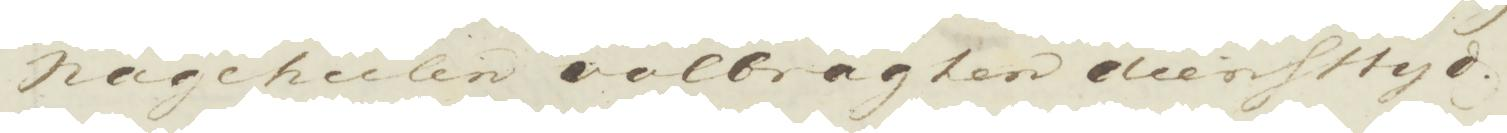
nageheelen volbragten diensttyd.
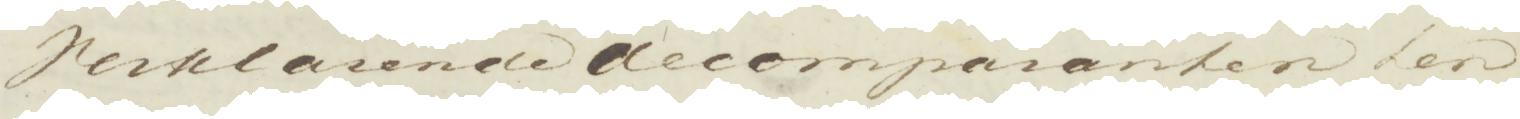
Verklarende de comparanten ten
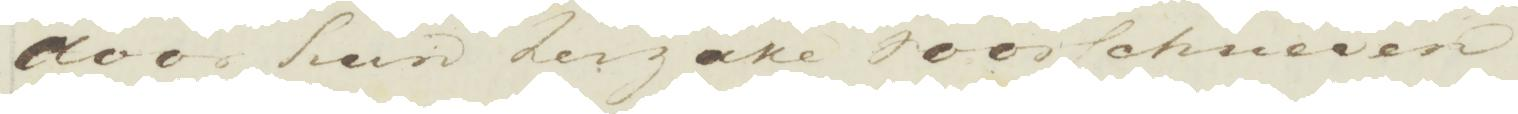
door hun terzake voorschreeven
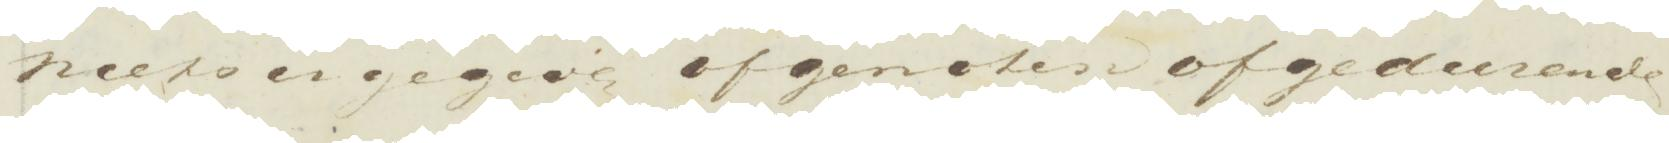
niets is gegeven of genoten of gedurenden
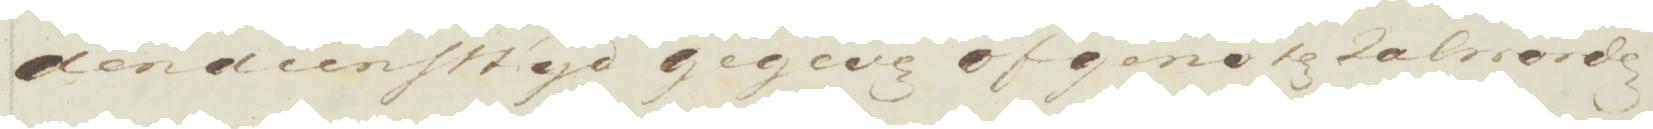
den diensstyd gegeven of genoten zal worden
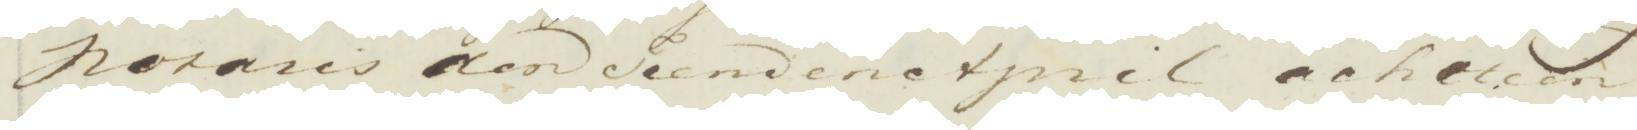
notaris den Tienden April achttien
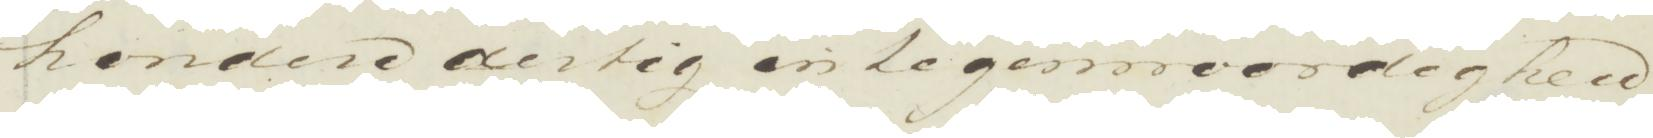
honderd dertig in tegenwoordigheid
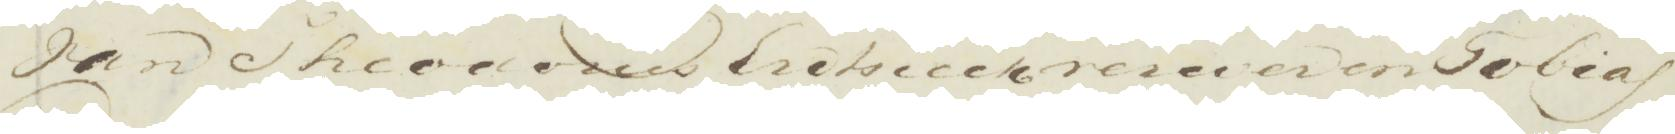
Van Theodorus Erdtsieck verwer en Tobias
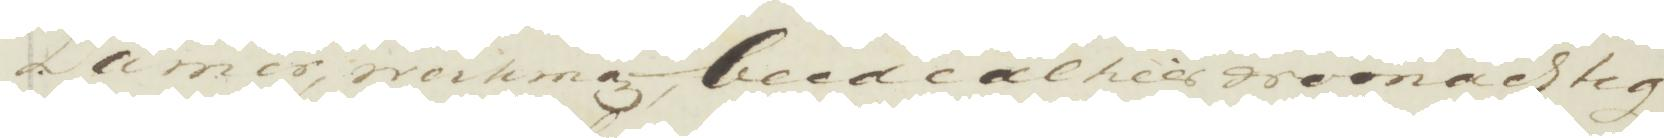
Damer, werkman, beide alhier woonachtig
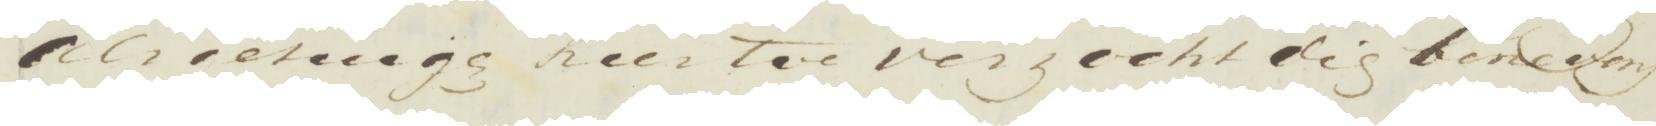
als getuigen hier toe verzocht die beneevens
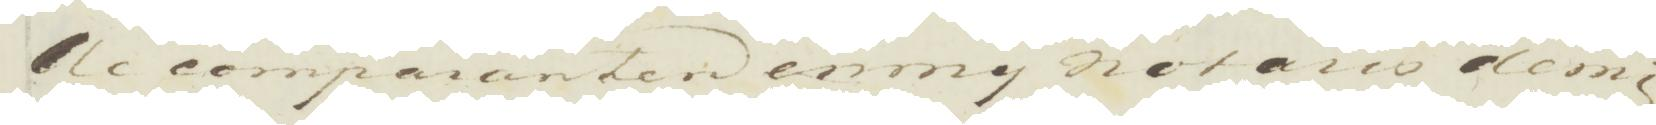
de comparanten en my notaris de mi
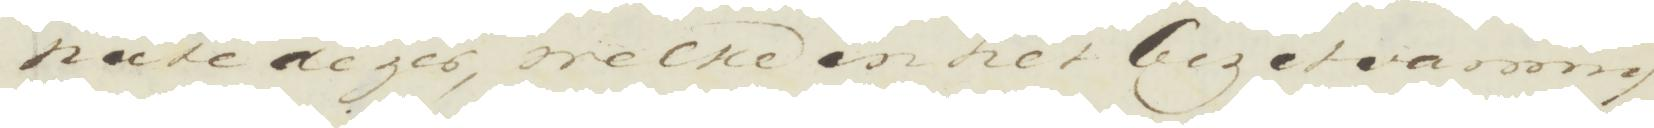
nute dezes, welke in het bezit van my
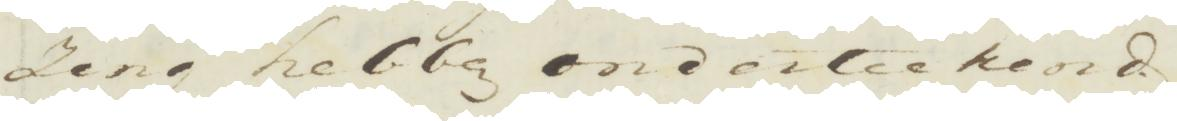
=zing hebben onderteekend.
